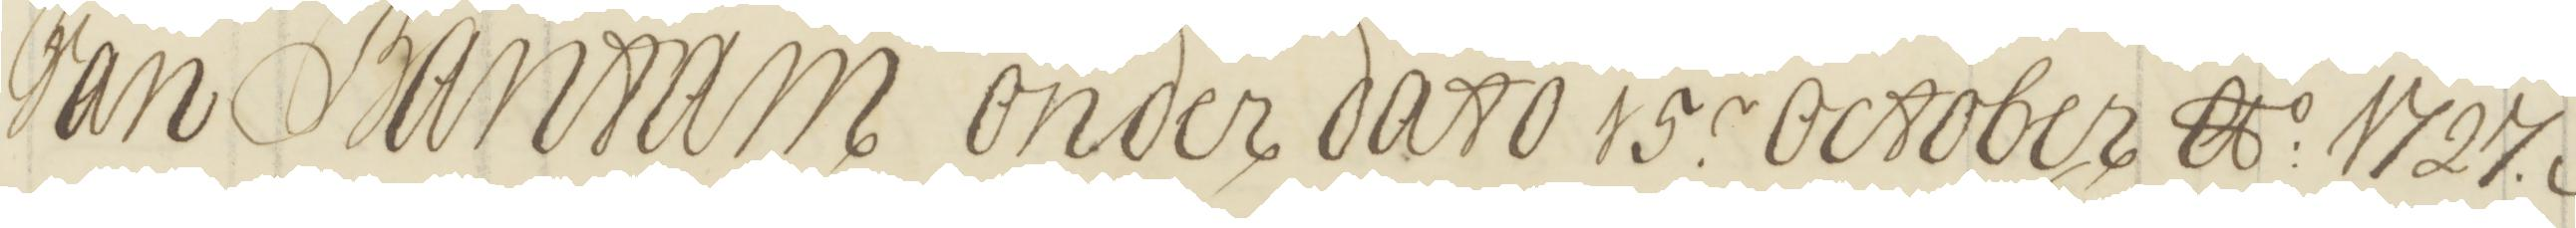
Van Bantam onder dato 15:' October A:o 1727.
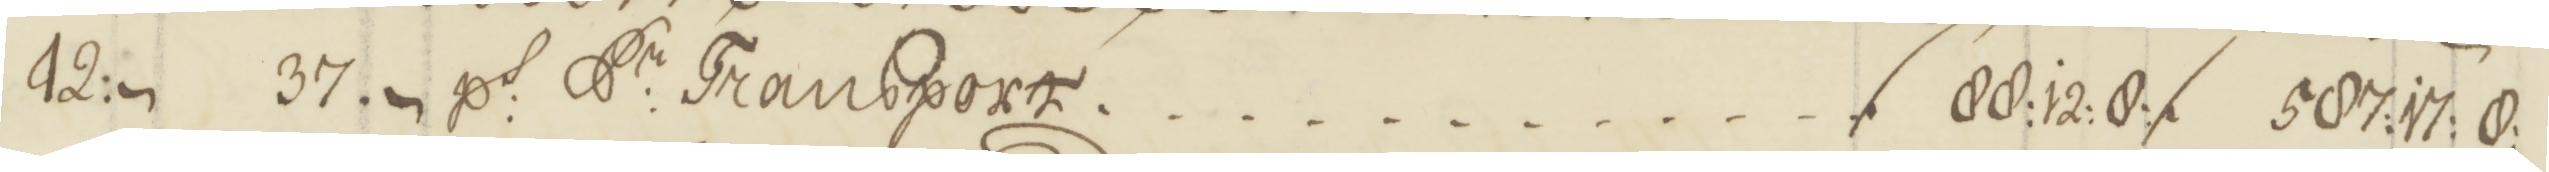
42:- 37.- p:s P:r Transport . . . . . . . . . . . ƒ 88: 12: 8: ƒ 587: 17: 8:
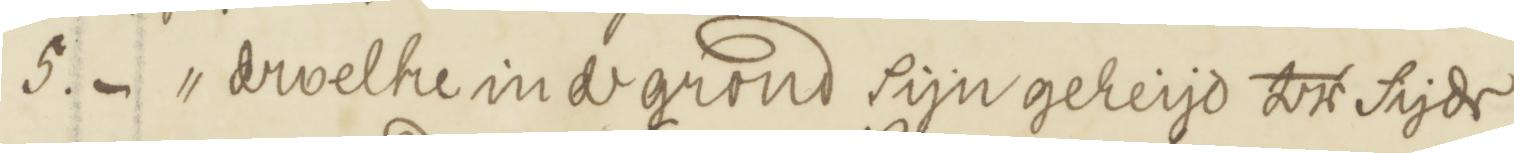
5.- „ dewelke in de grond sijn geheijd ter sijde
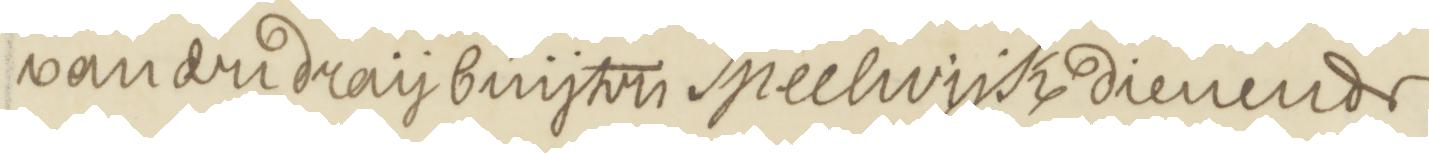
van den draij buijten speelwijk dienende
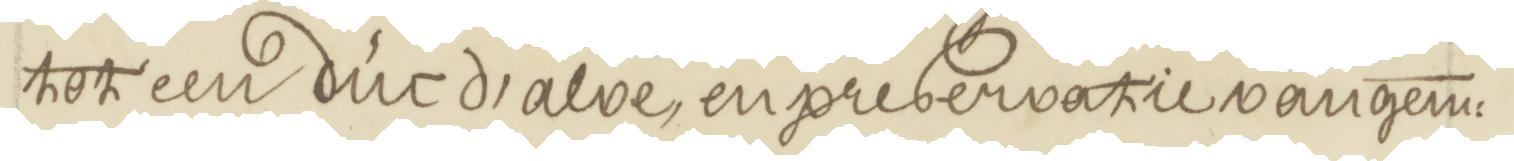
tot een duc d'alve, en preservatie van gem:
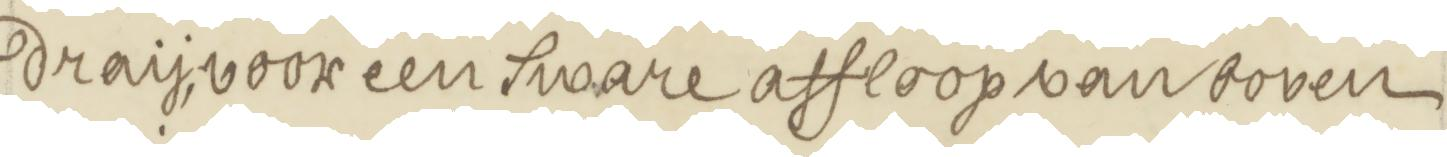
draij, voor een sware affloop van boven
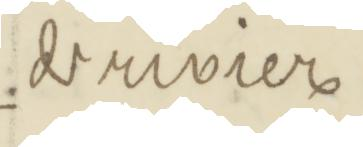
de rivier
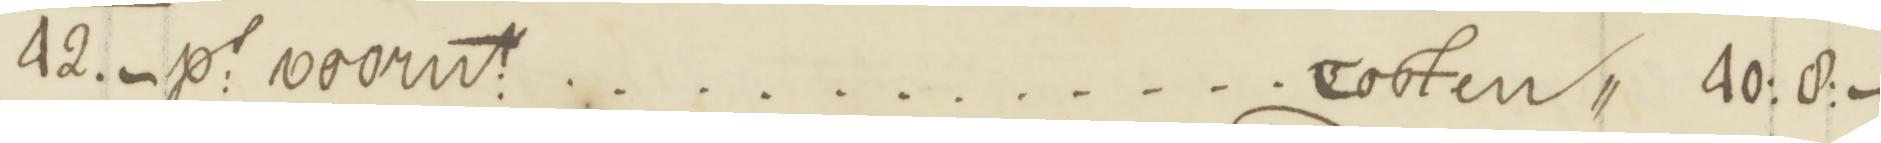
42.- p:s voorn:t . . . . . . . . . . . . costen „ 40: 8:-
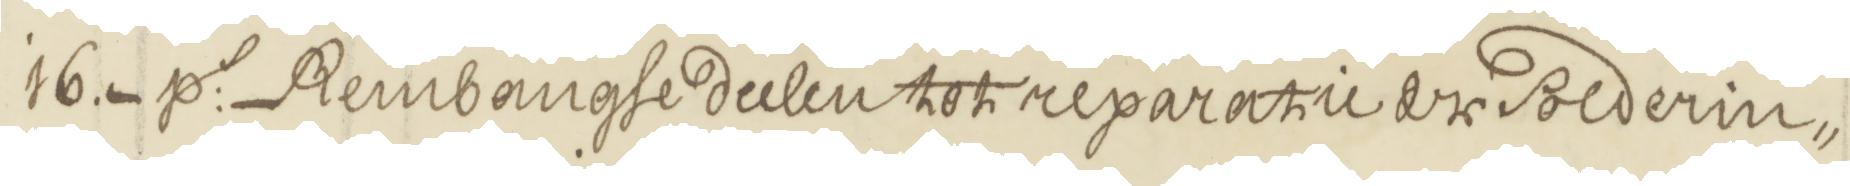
16.- p:s Rembangse deelen tot reparatie der solderin„
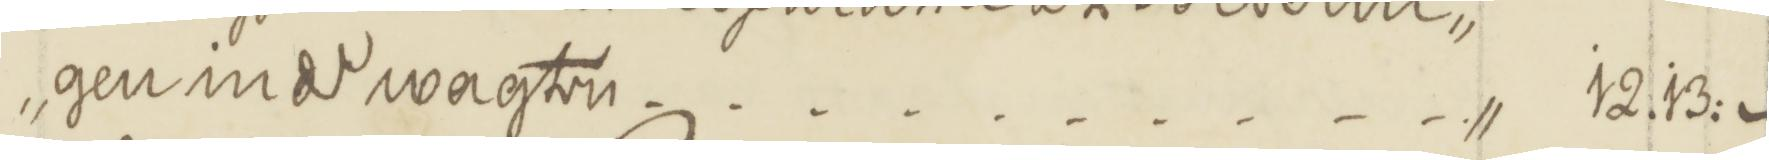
„gen in de wagten . . . . . . . . . . .„ 12: 13:-
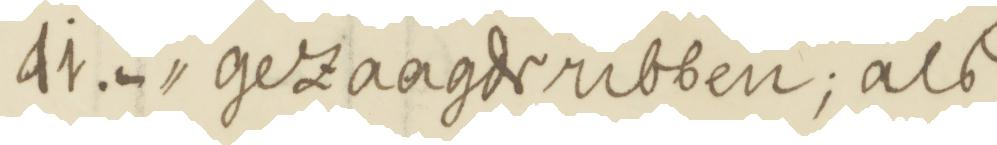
41.- „ gezaagde ribben; als
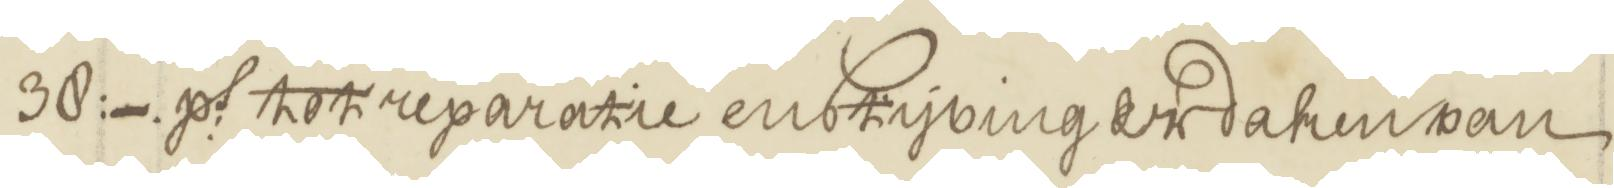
38:-. p:s tot reparatie en stijving der daken van
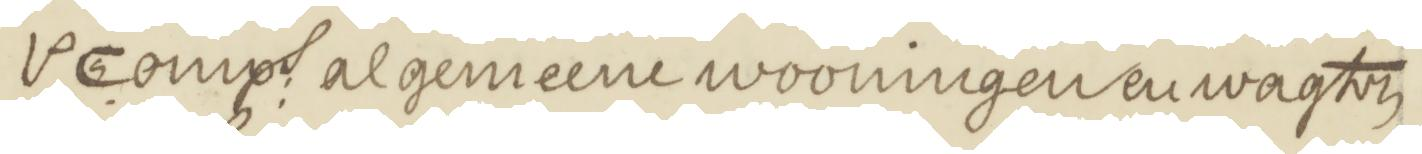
s Comp:s algemeene wooningen en wagten
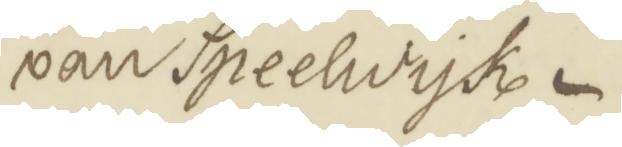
van speelwijk -
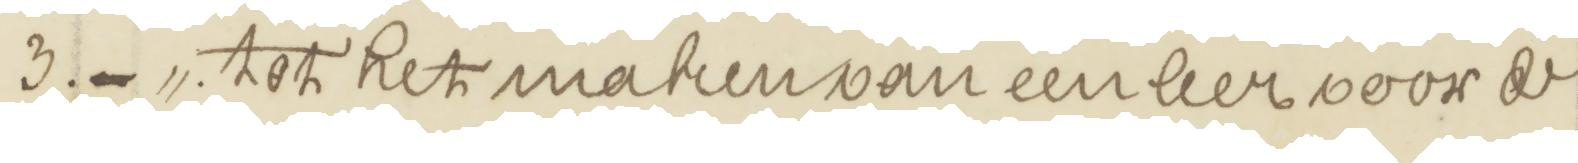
3.- „. tot het maken van een leer voor de
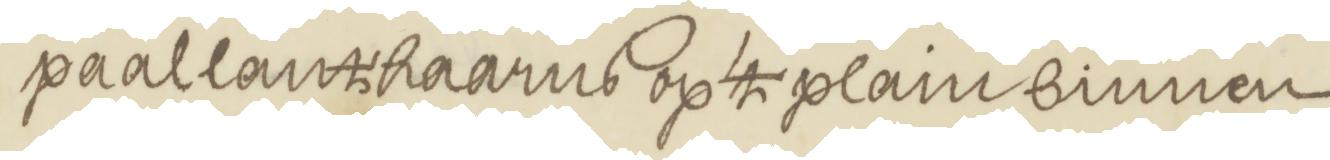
paallanthaarns op ’t plain binnen
